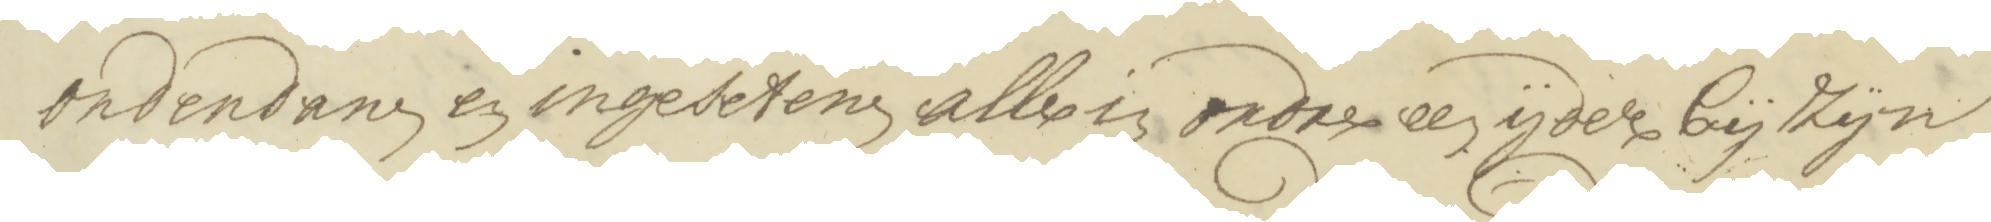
onderdanen en ingesetenen alle in ordre een ijder bij Zijn
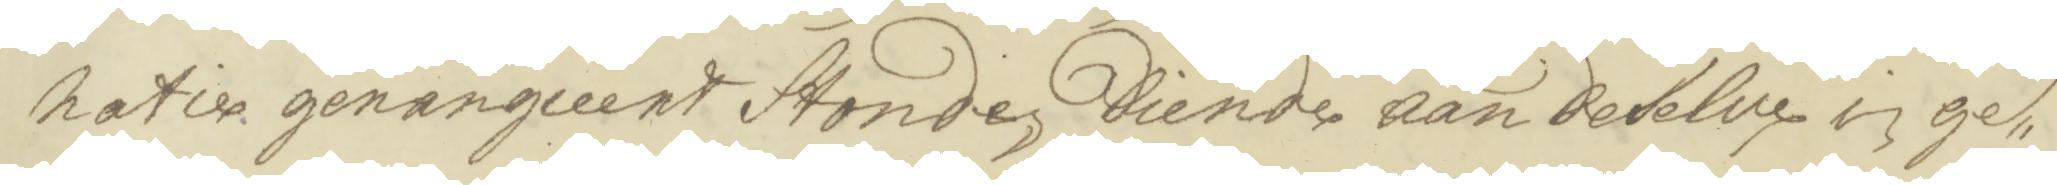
natie gerangieert Stonden, diende aan deselve in ge„
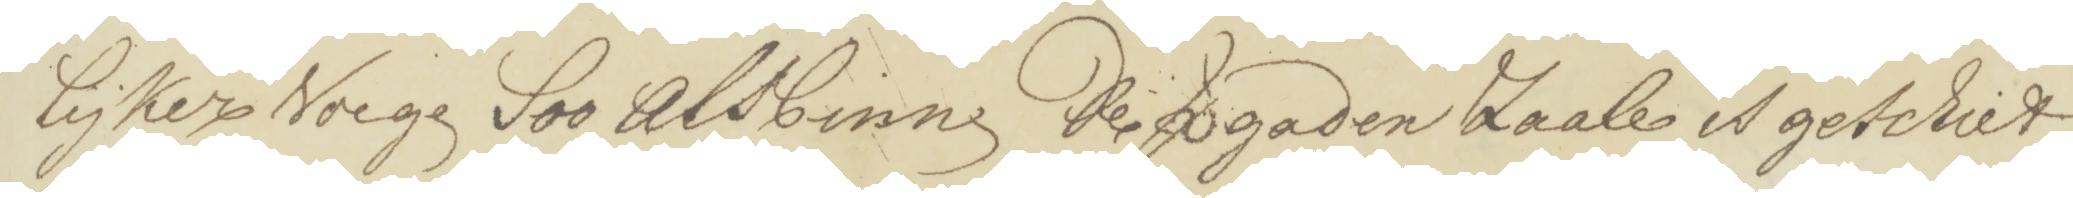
lijker Voege Soo als binnen de vergader Zaale is geschiet
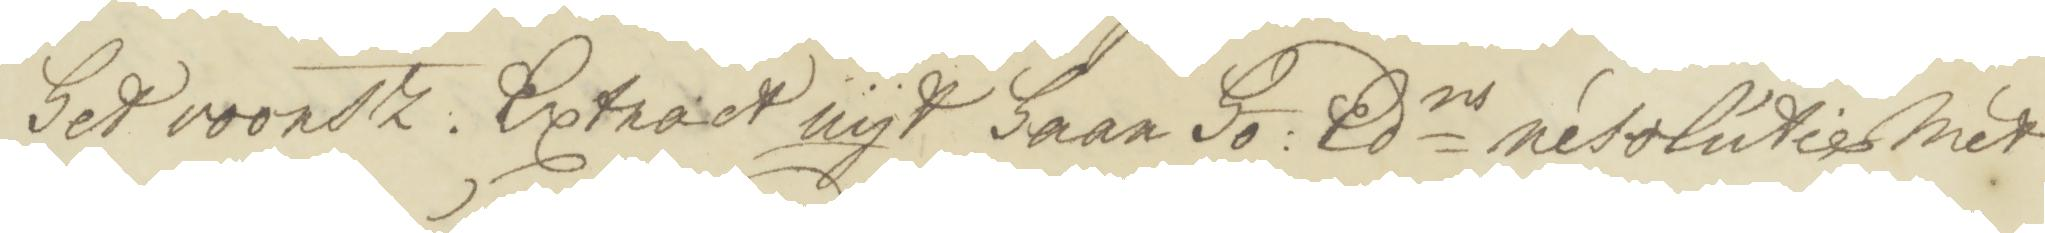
het voorsz: Extract uijt haar ho: Ed=ns resolutie met
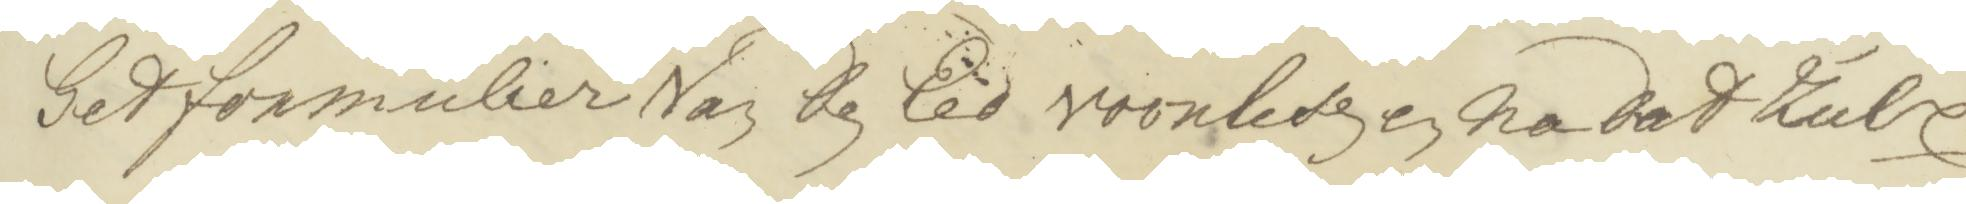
het formulier Van de Eed voorlesen en na dat Zulx
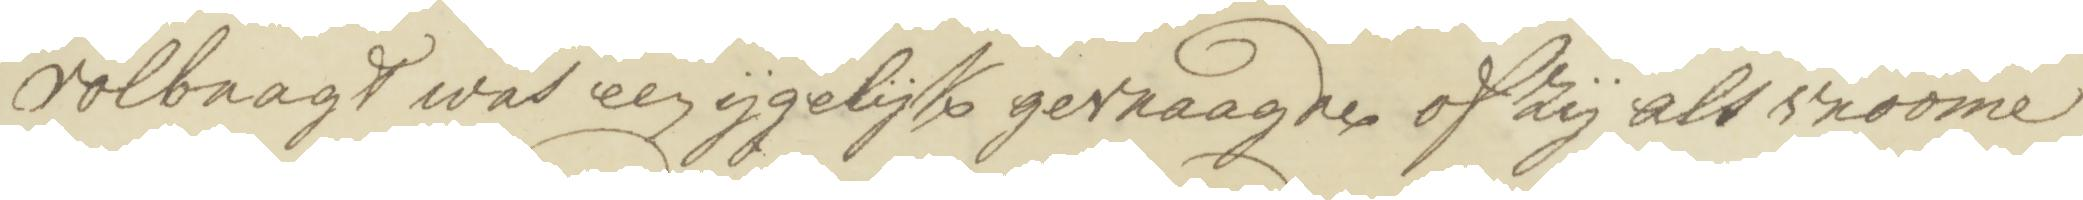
volbragt was een ijgelijk gevraagde of Zij als vroome
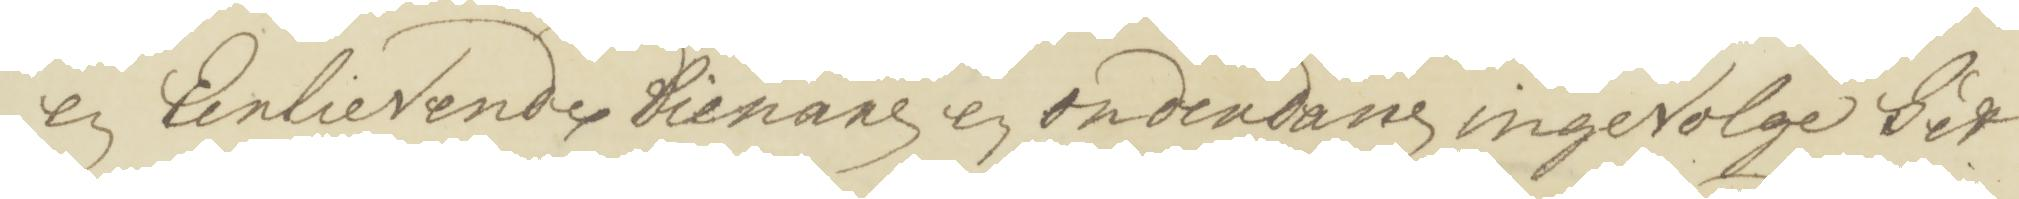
en Eerlievende dienaren en onderdanen ingevolge het
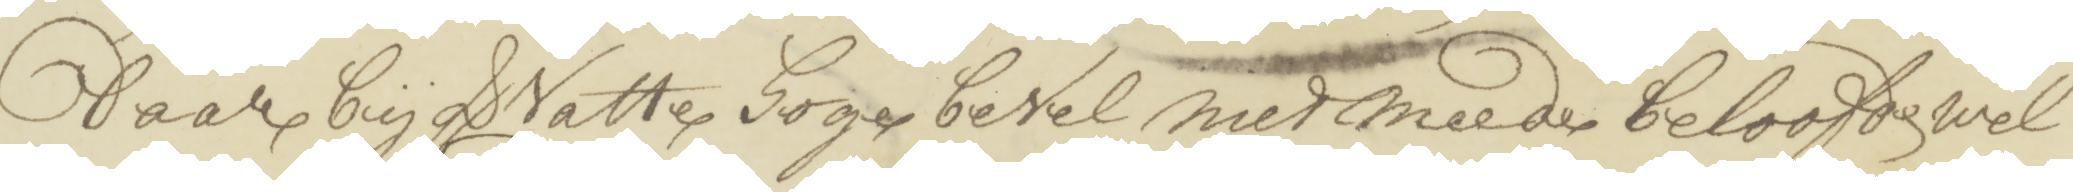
daar bij vervatte hoge bevel niet meede beloofden wel
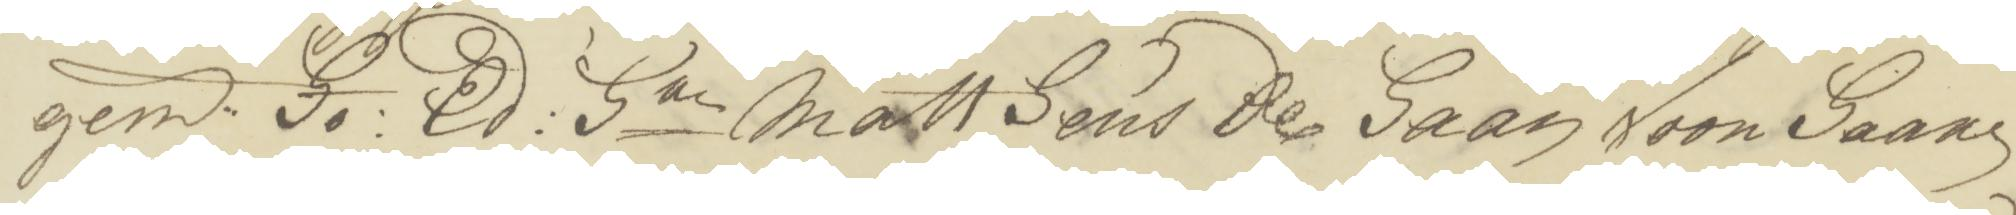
gem: ho: Ed: 'h=re Mattheus de haan Voor haaren
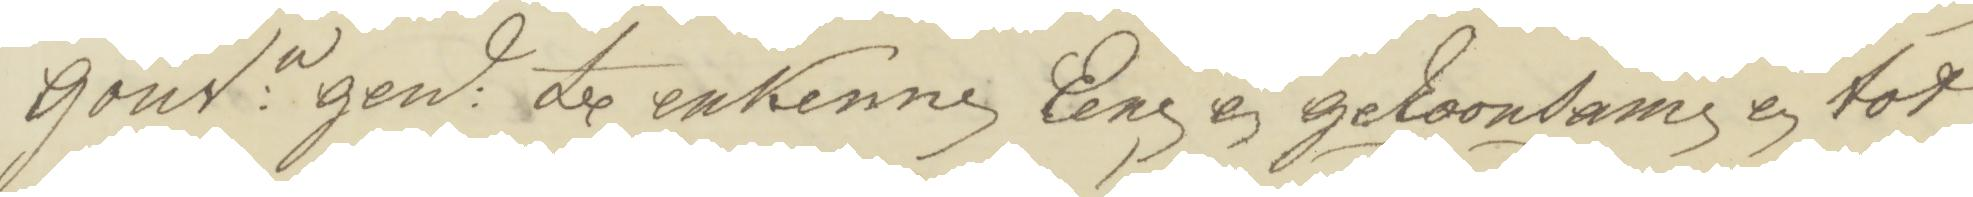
Gouv:r gen:l te erkennen Eeren en gehoorsamen en tot
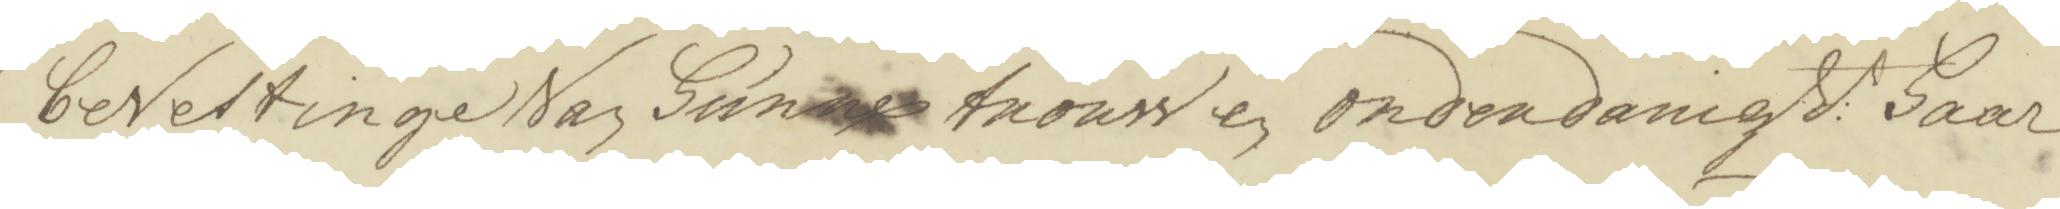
bevestinge Van hunne trouw en onderdanigh:t haar
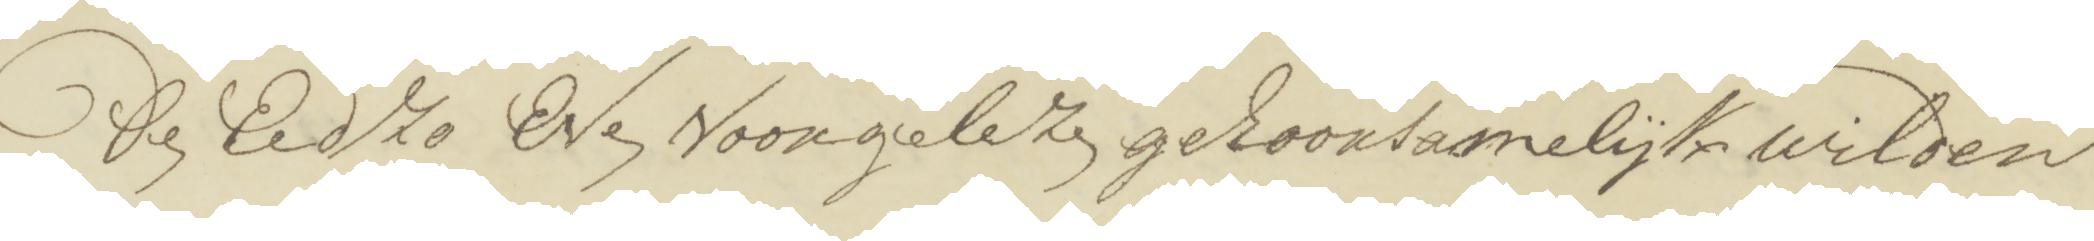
die Eed Zo Even Voorgelezen gehoorsamelijk wilden
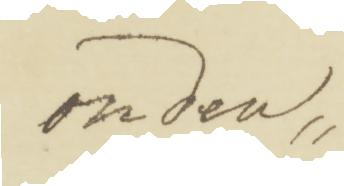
onder„
